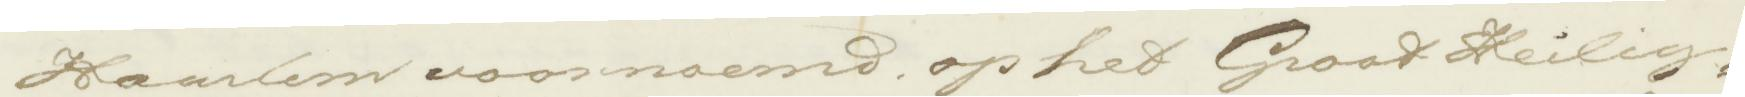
Haarlem voornoemd, op het Groot Heilig„
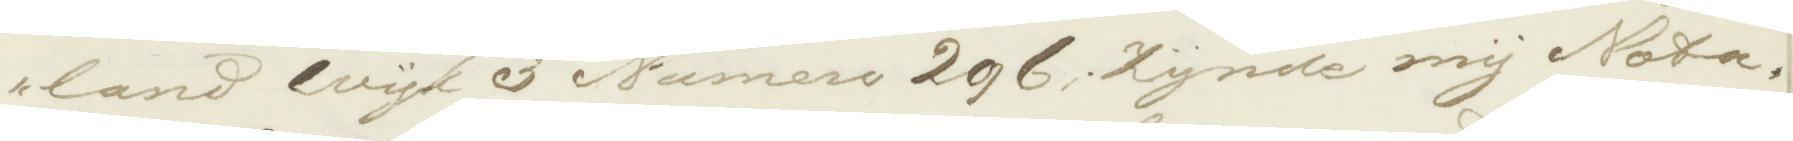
„land wijk 3 Numero 296; zijnde mij Nota„
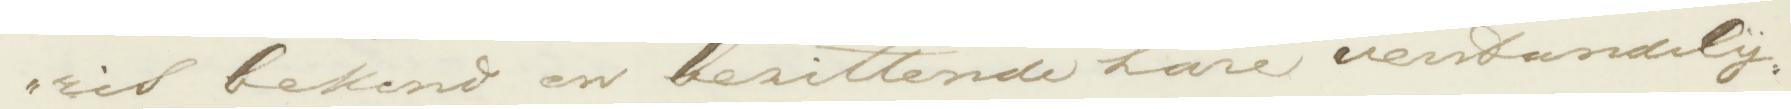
„ris bekend en bezittende hare verstandelij„
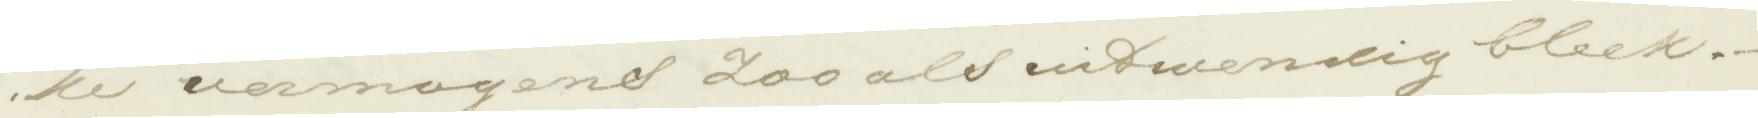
„ke vermogens zoo als uitwendig bleek.
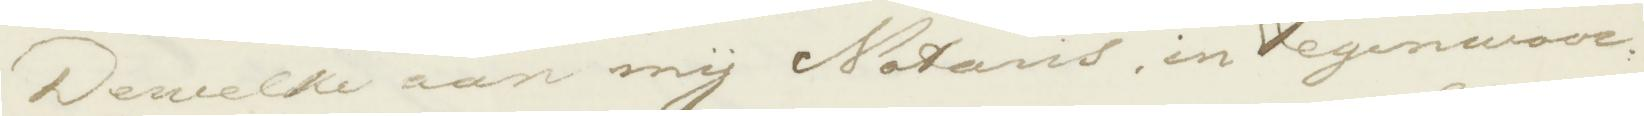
Dewelke aan mij Notaris, in tegenwoor„
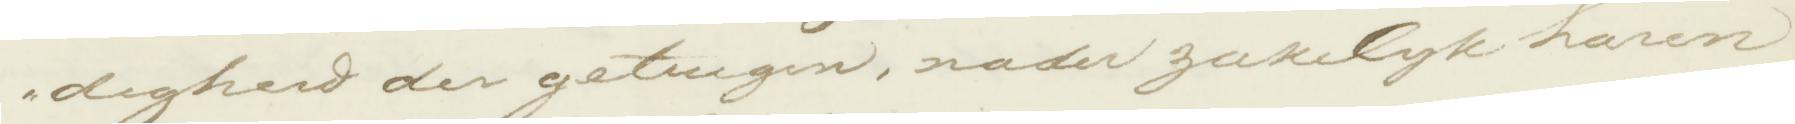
„digheid der getuigen, nader zakelyk haren
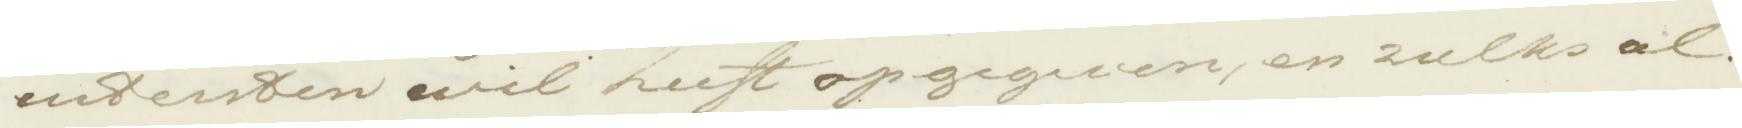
uitersten wil heeft opgegeven, en zulks al.
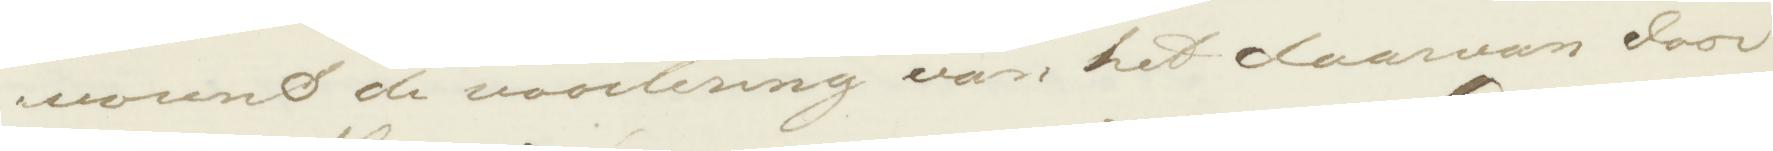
vorens de voorlezing van het daarvan door
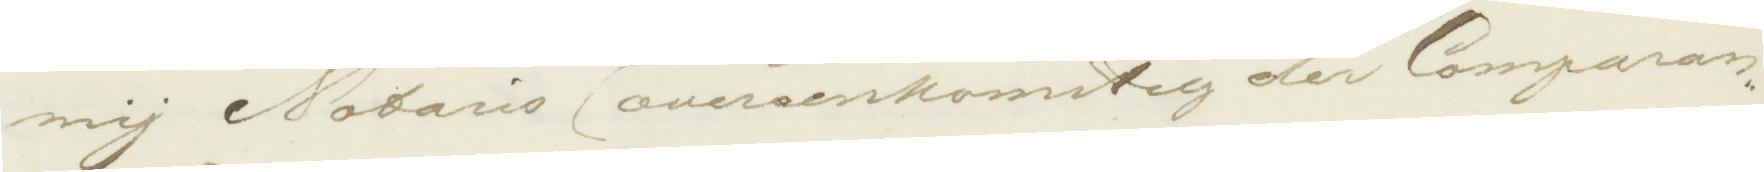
mij Notaris (overeenkomstig der Comparan„
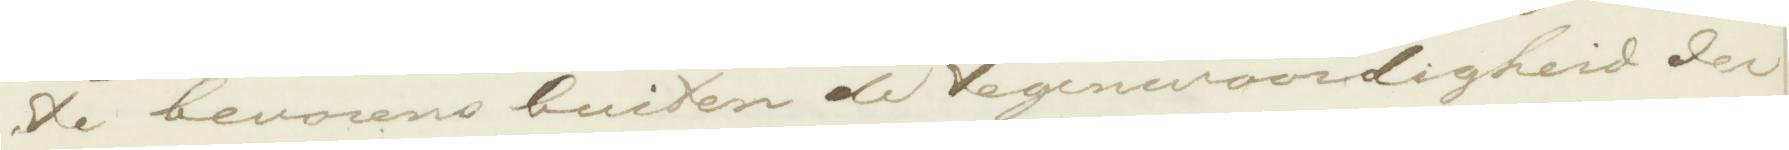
,te bevorens buiten de tegenwoordigheid der
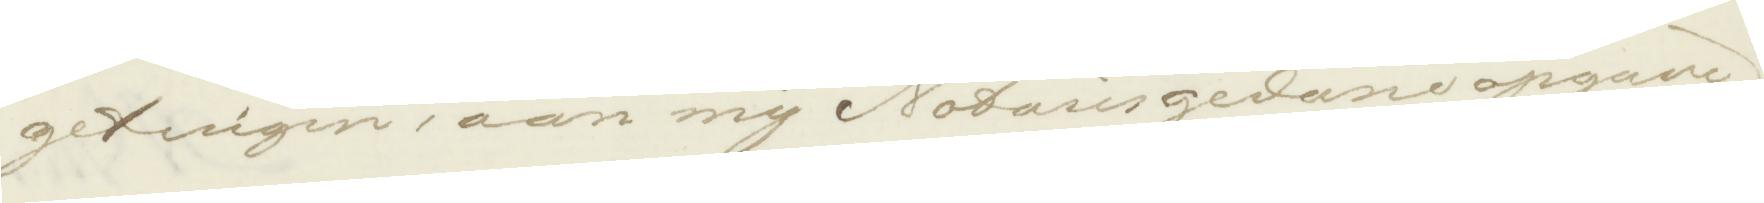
getuigen, aan mij Notaris gedane opgave)
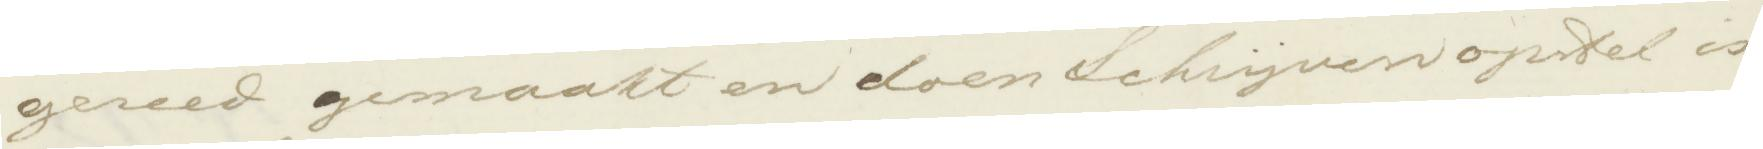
gereed gemaakt en doen schrijven opstel is
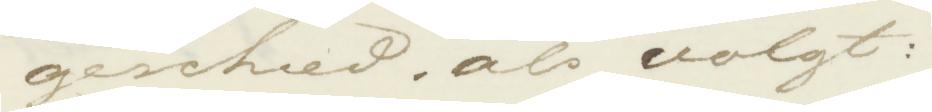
geschied, als volgt:
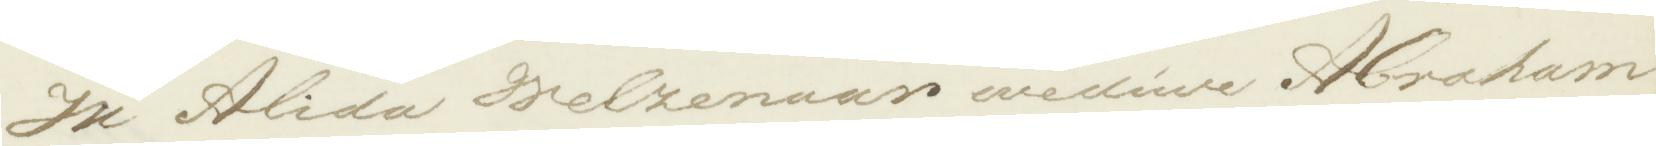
Ik Alida Welzenaar weduwe Abraham
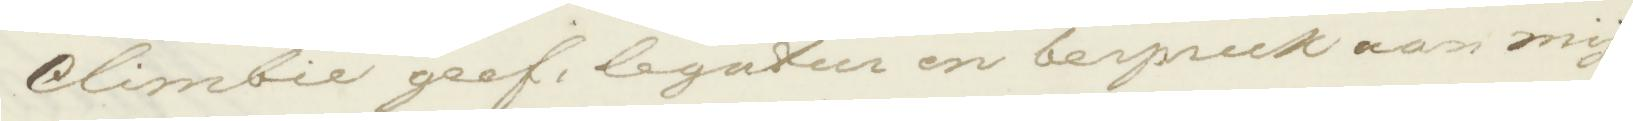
Climbie geef, legateer en bespreek aan mij
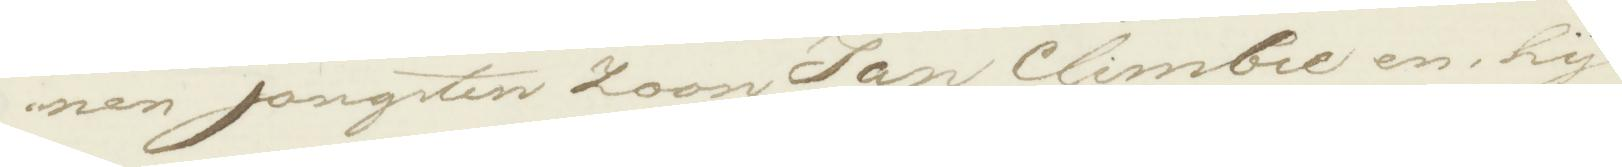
„nen jongsten zoon Ian Climbie en, hij
